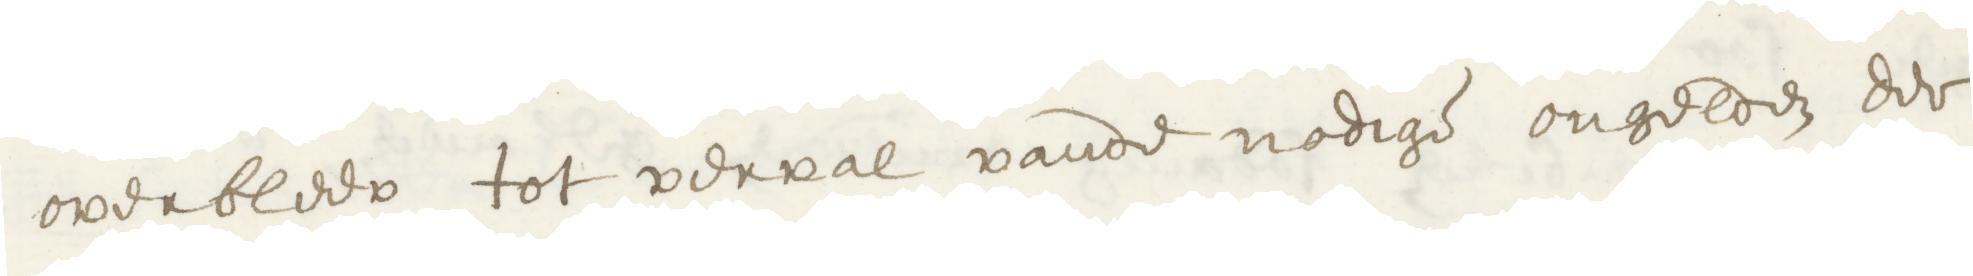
overbleev tot verval vande nodige ongelden der
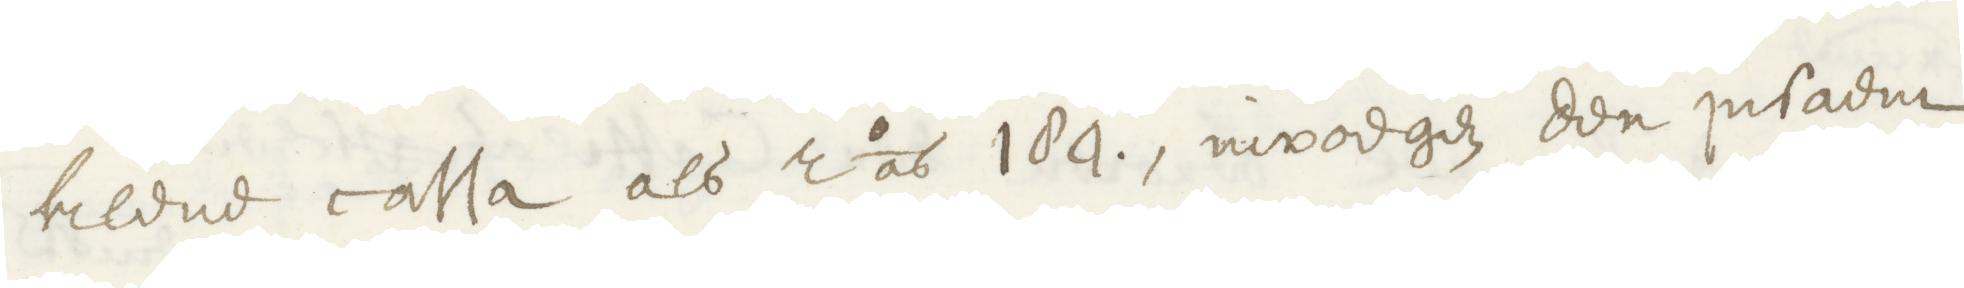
klene cassa als r o/as 184., invoegen der jnsaem
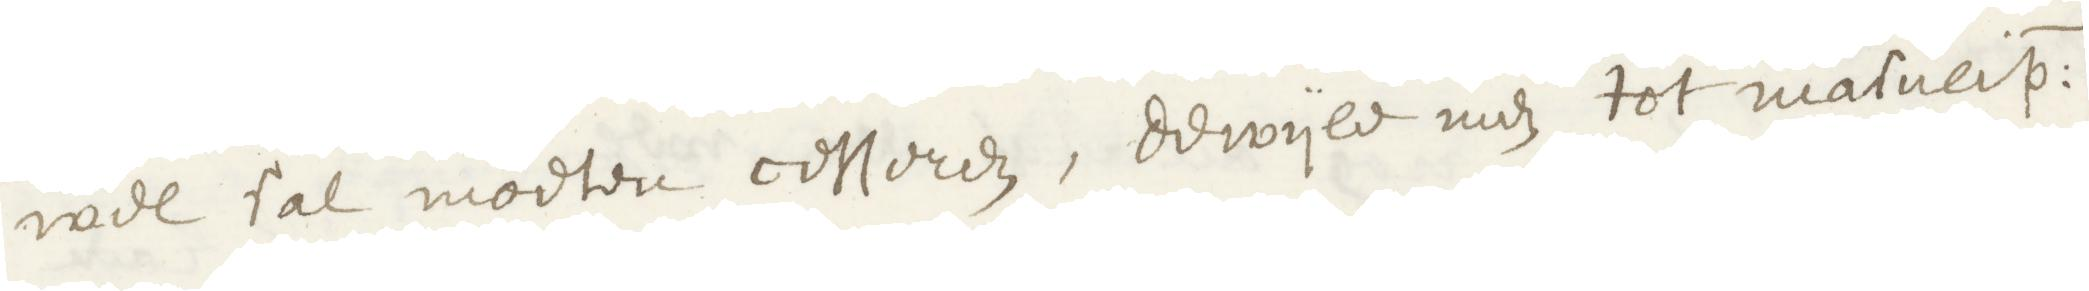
wel sal moeten cesseren, dewijle men tot masulip:
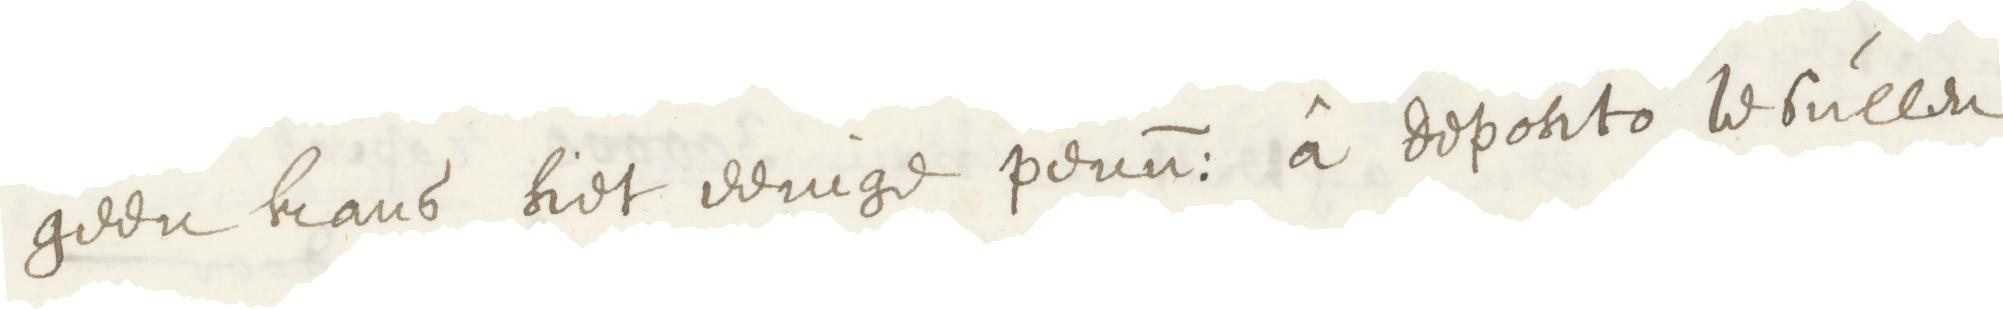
geen kans siet eenige penn: â deposito te sullen
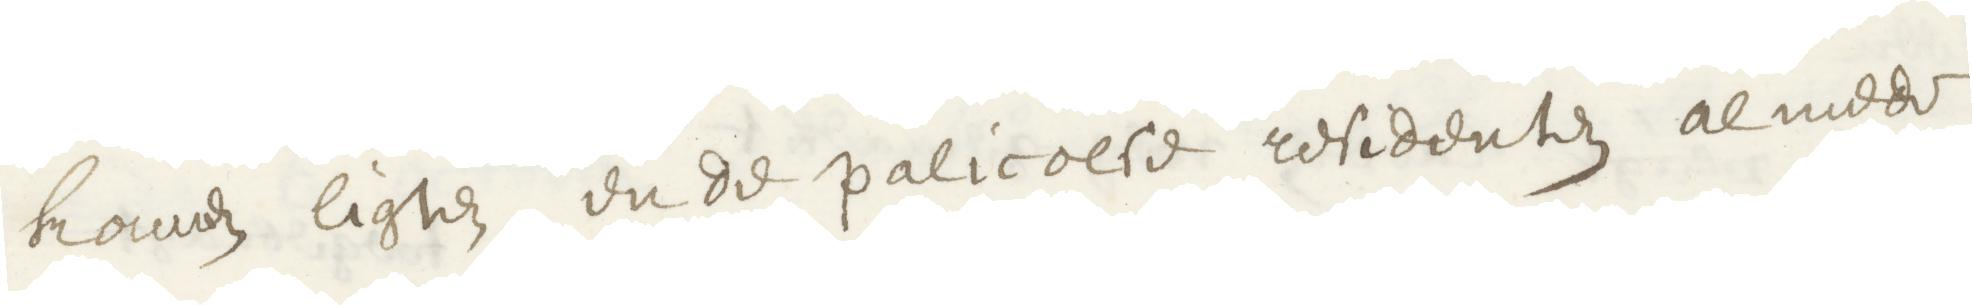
konnen ligten, en de palicolse residenten al mede
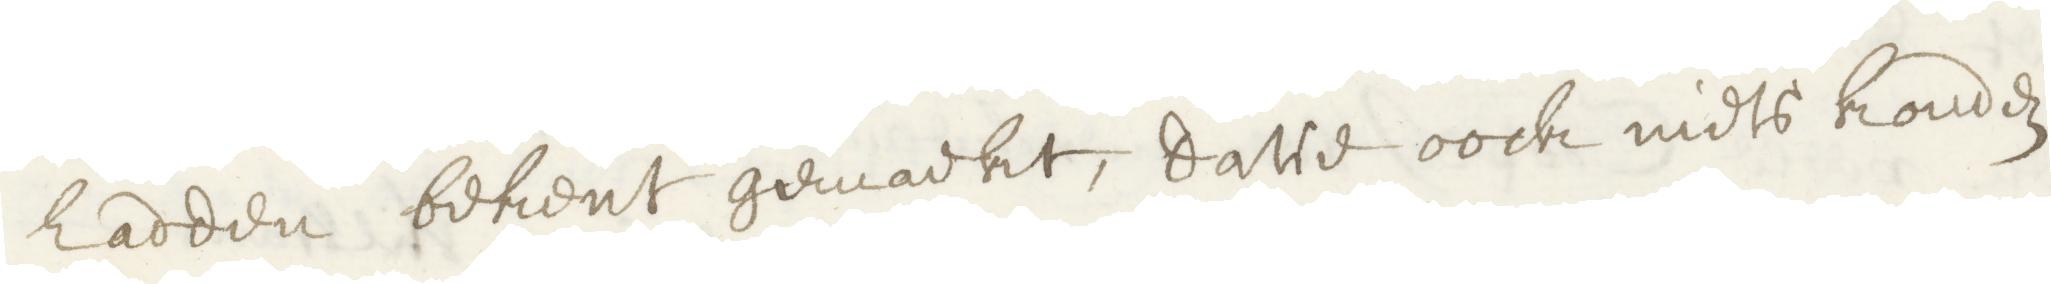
hadden bekent gemaekt, datse oock niets konden
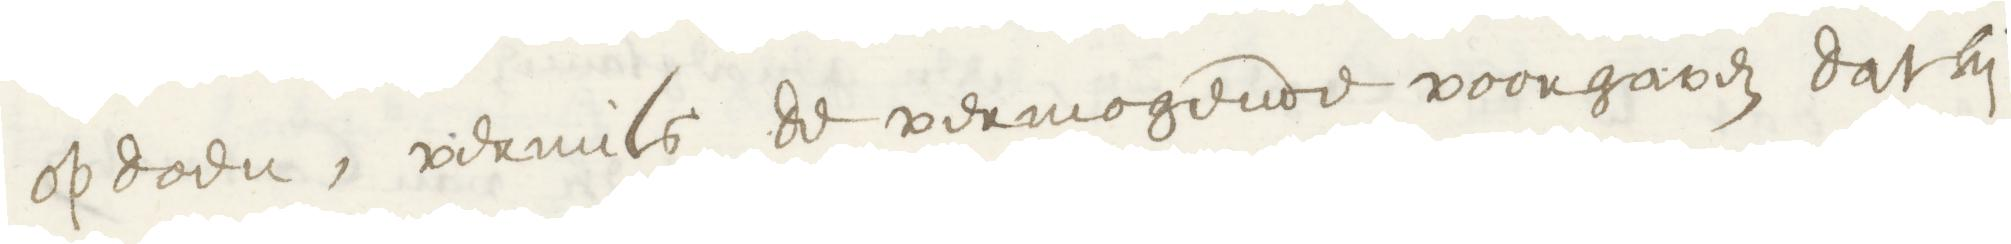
op doen, vermits de vermogende voorgaven dat sij
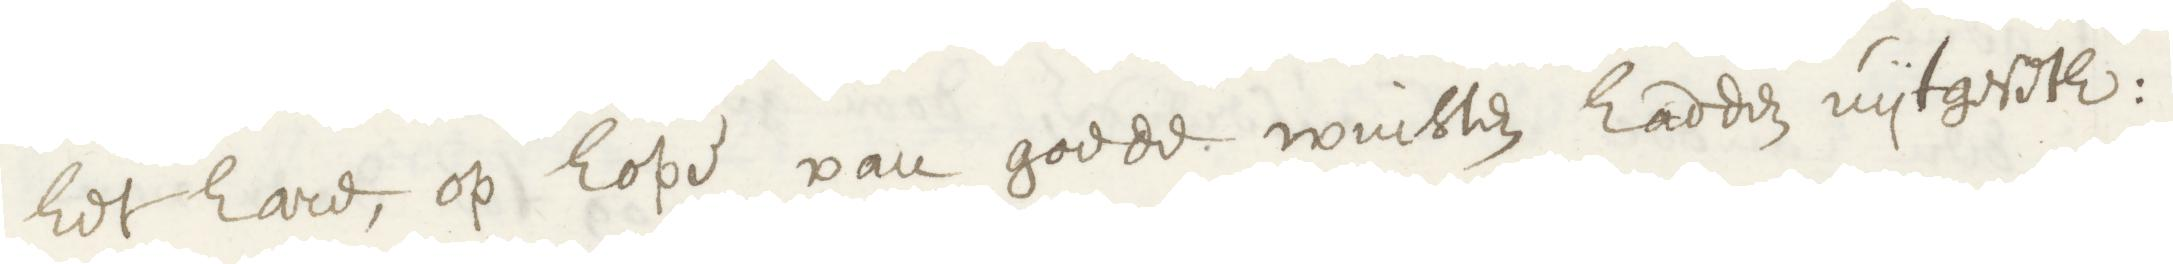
het hare, op hope van goede winsten hadden uijtgeseth:
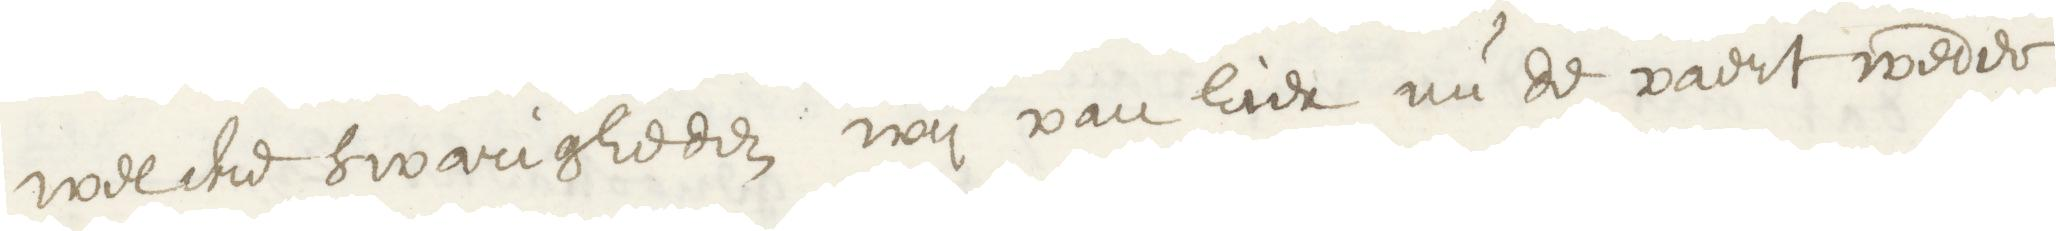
welcke swarigheden wij van hier nu de vaert weder
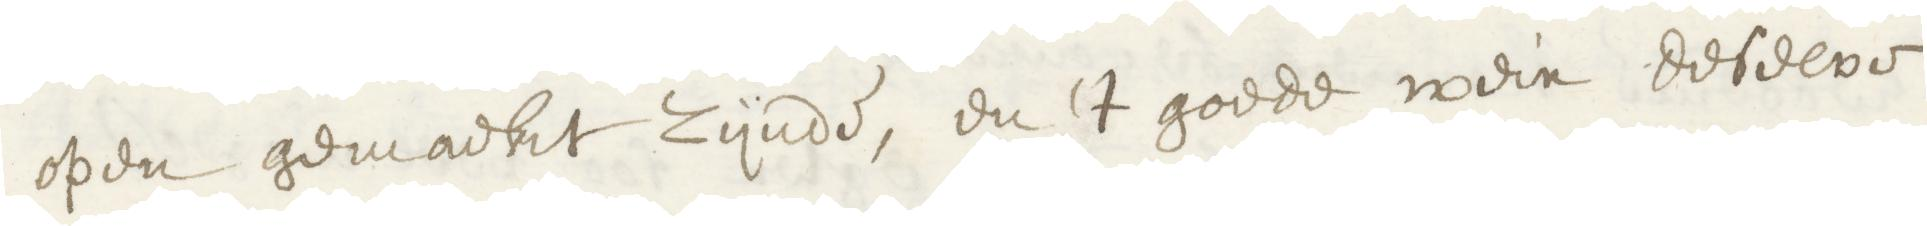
open gemaekt zijnde, en ’t goede weir deselve
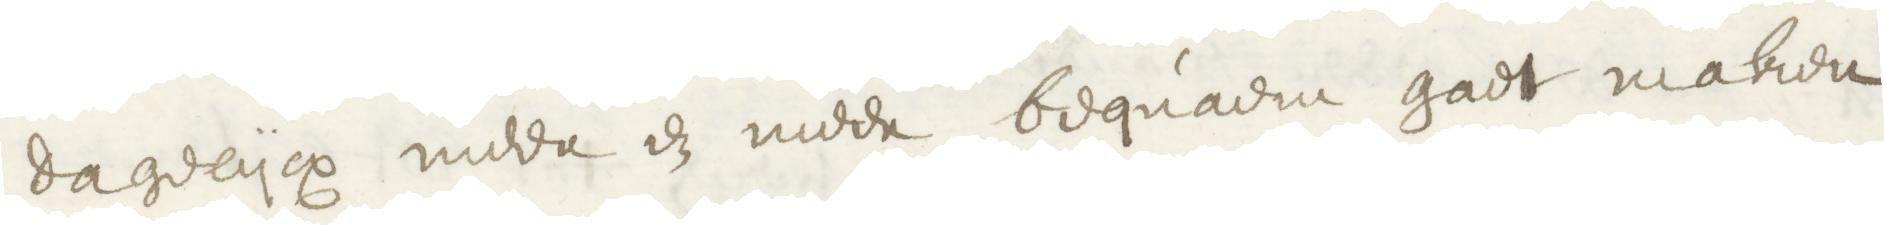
dagelijcx meer en meer bequaem gaet maken
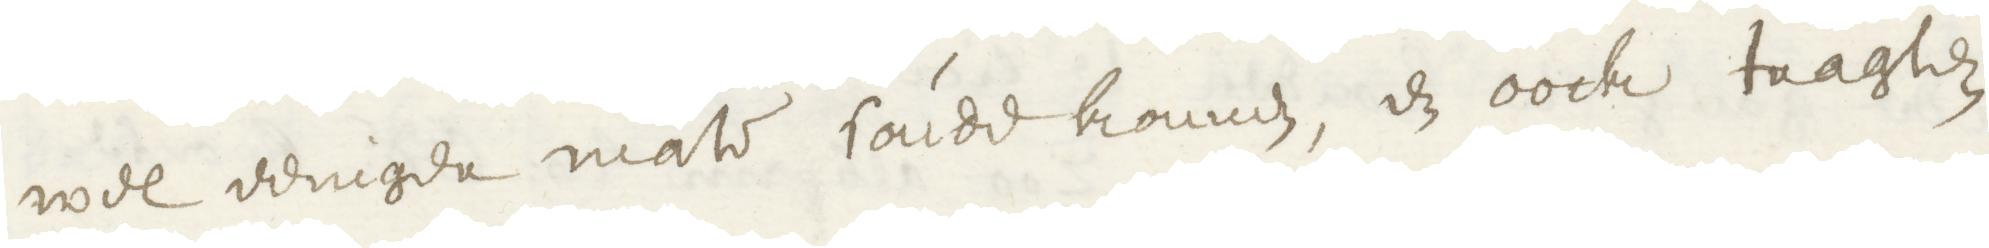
wel eeniger mate soude konnen, en oock tragten
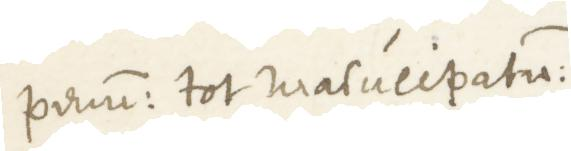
penn: tot masulipatn
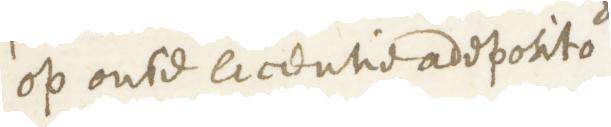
op onse licentie adeposito
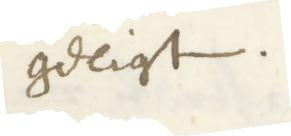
geligt.
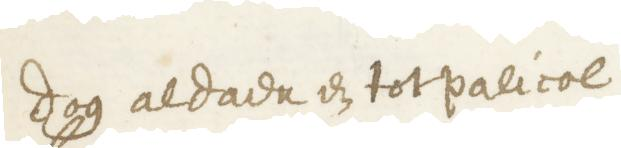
dog aldaer en tot palicol
